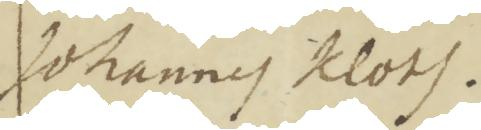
Johannes Klots.
